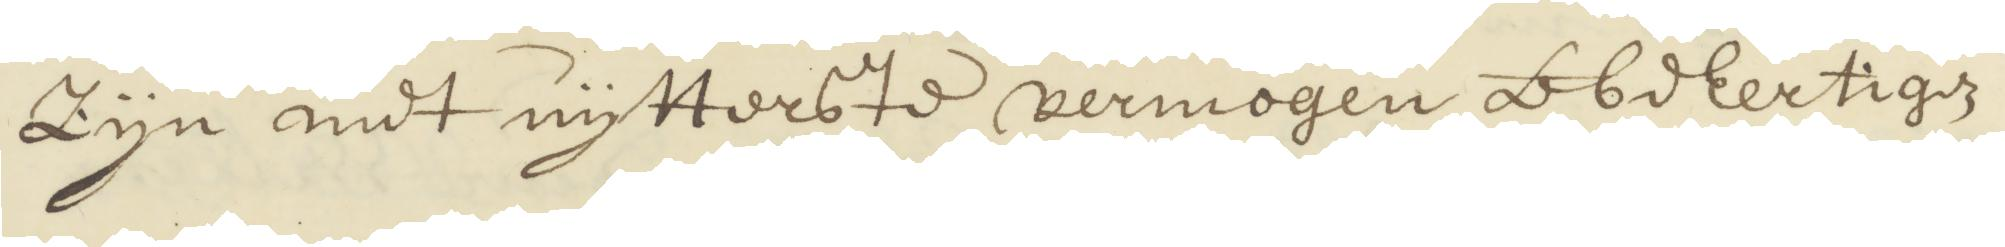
Zijn met uijtterste vermogen te behertigen
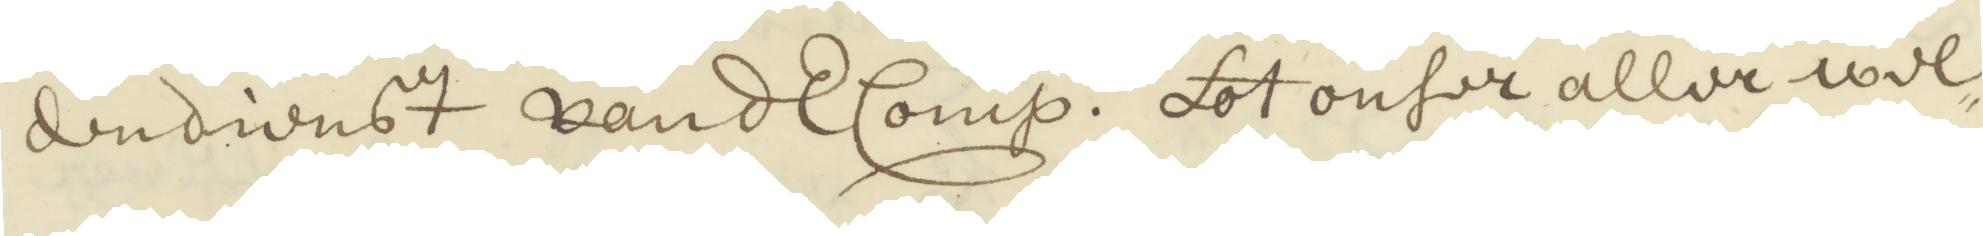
den dienst van d E Comp: tot onser aller wel„
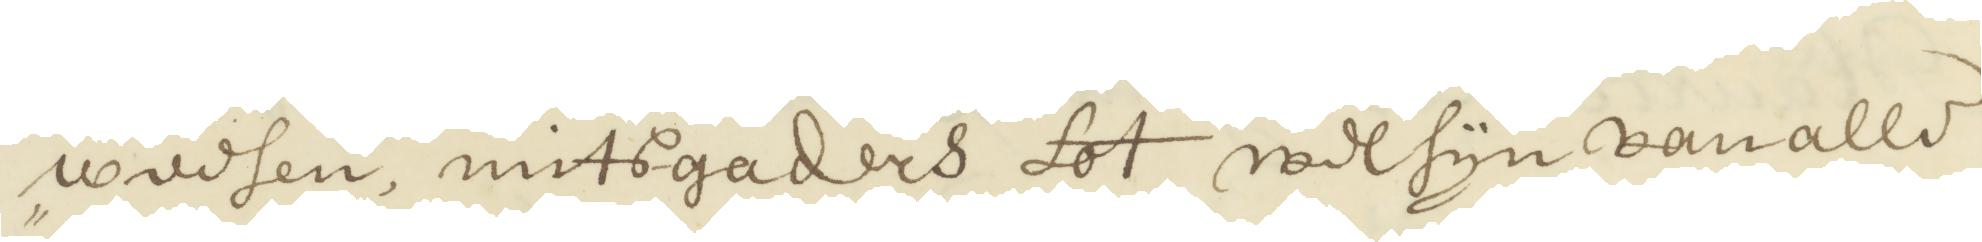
„weesen, mitsgaders tot welsijn van alle
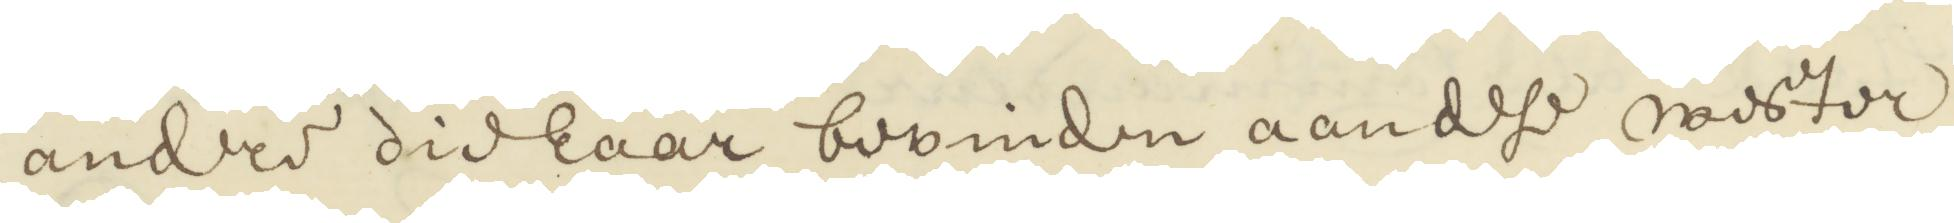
andere die haar bevinden aan dese wester
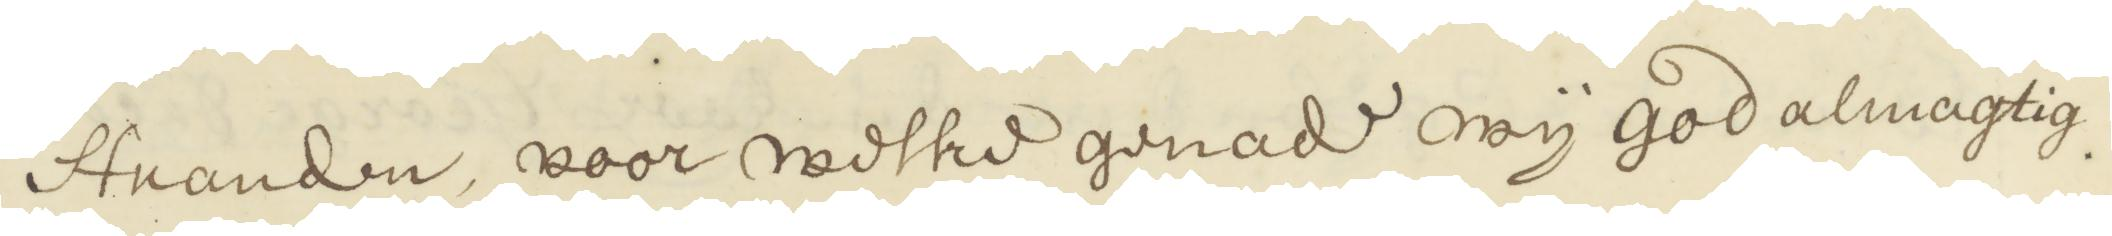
stranden, voor welke genade wij god almagtig
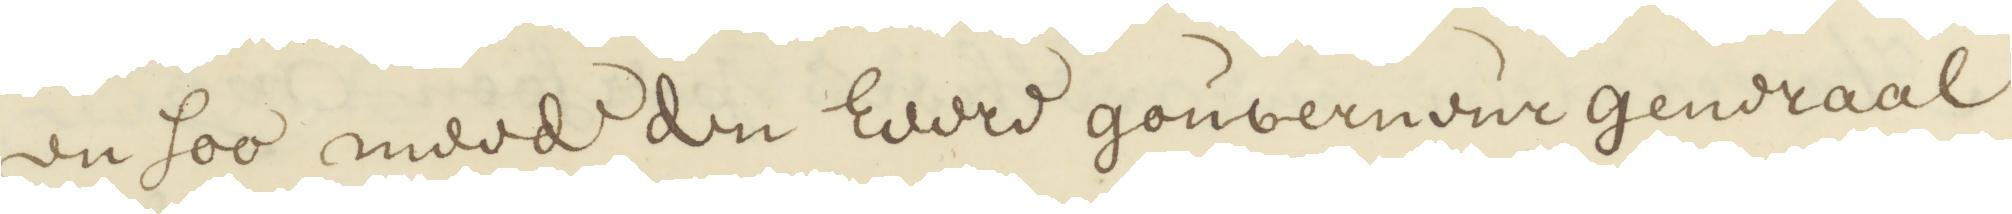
en soo meede den heere gouverneur generaal
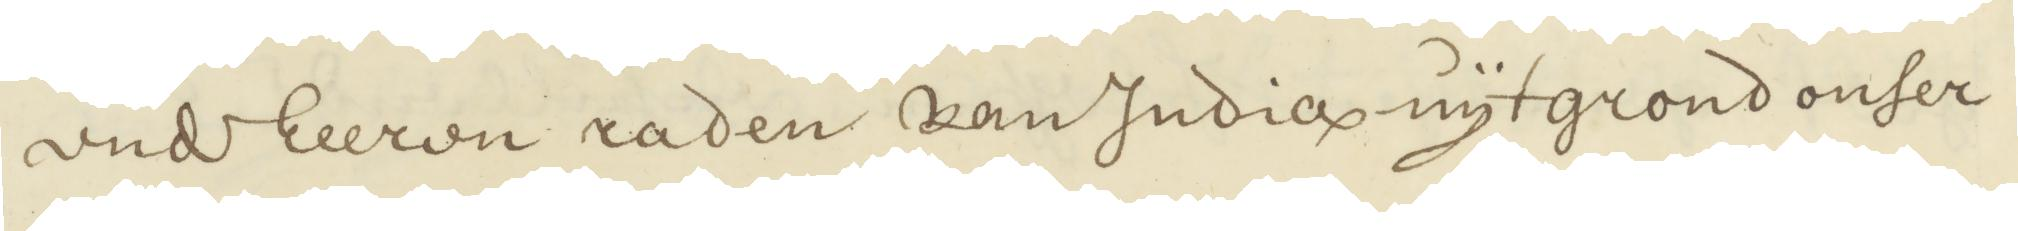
ende heeren raden van Jndia uijt grond onser
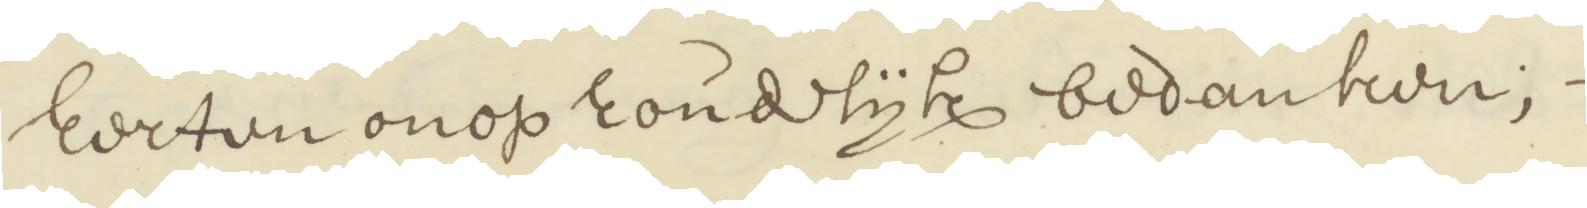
herten on op houdelijk bedanken;
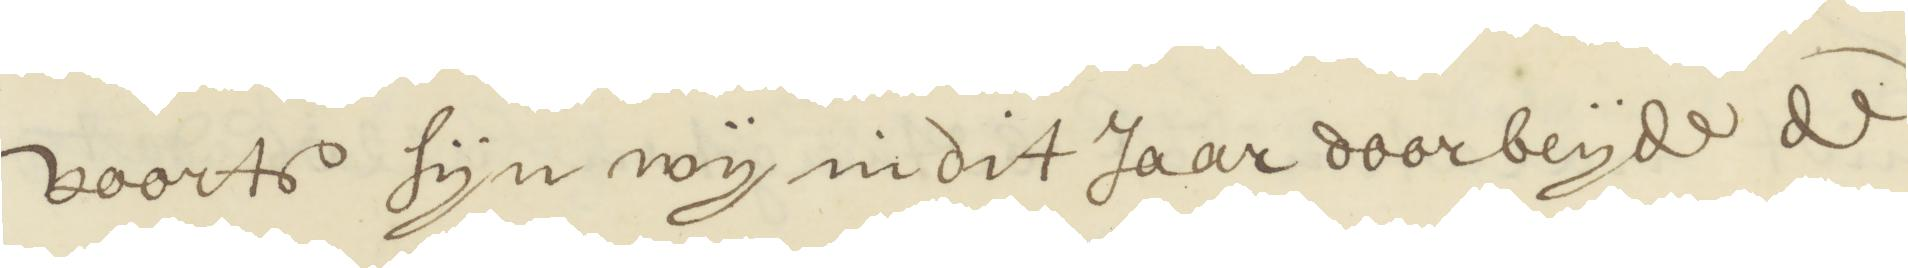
voorts sijn wij in dit Jaar door beijde de
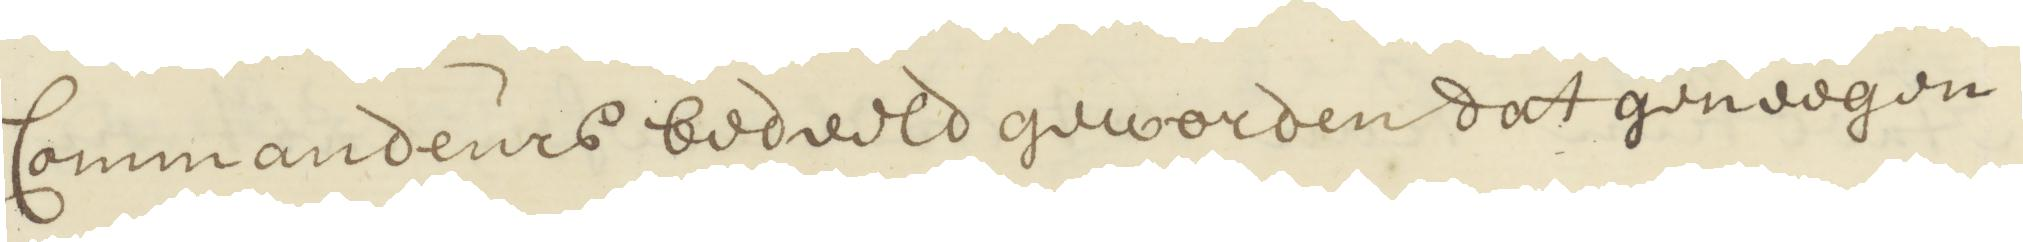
Commandeurs bedeeld geworden dat geneegen
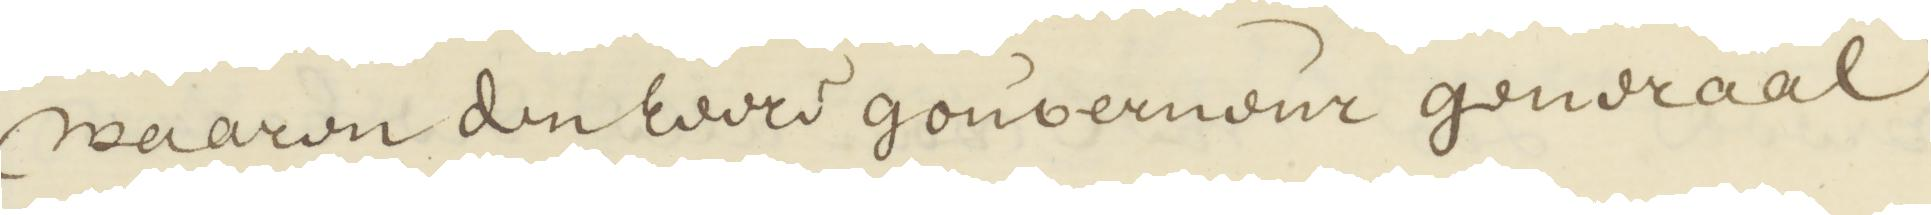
waaren den heere gouverneur generaal
